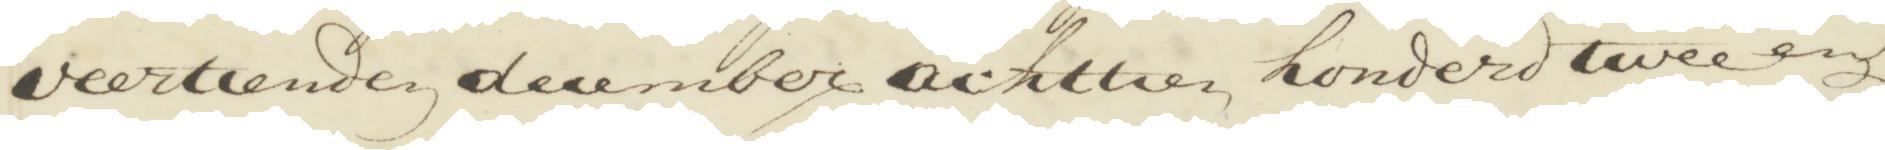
veertienden december achttien honderd twee en
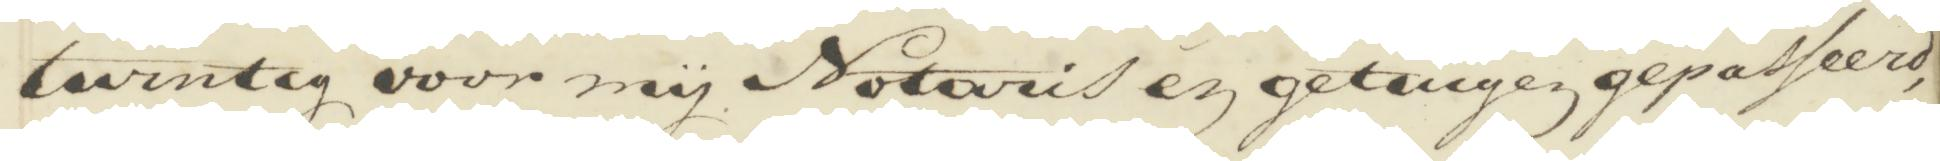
twintig voor mij Notaris en getuigen gepasseerd,
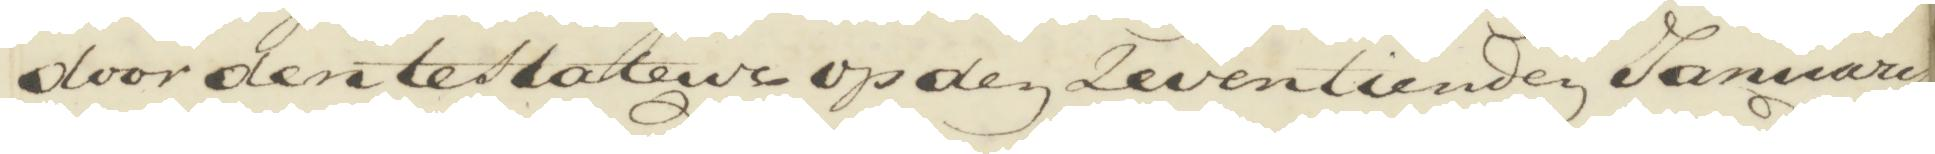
door den testateur op den Zeventienden Ianuary
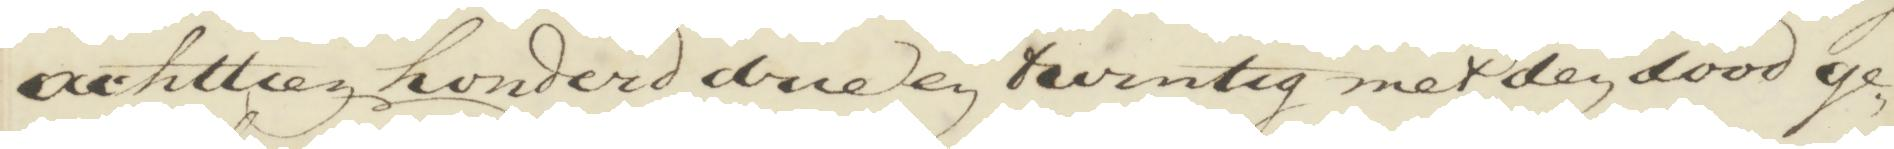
achttien honderd drie en twintig met den dood ge„
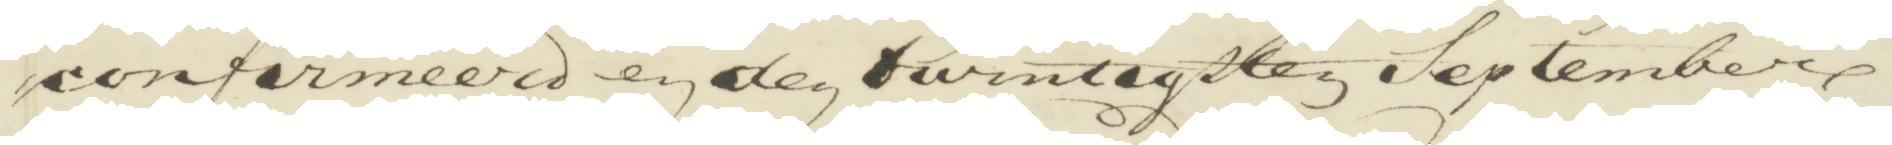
„confirmeerd en den twintigsten September
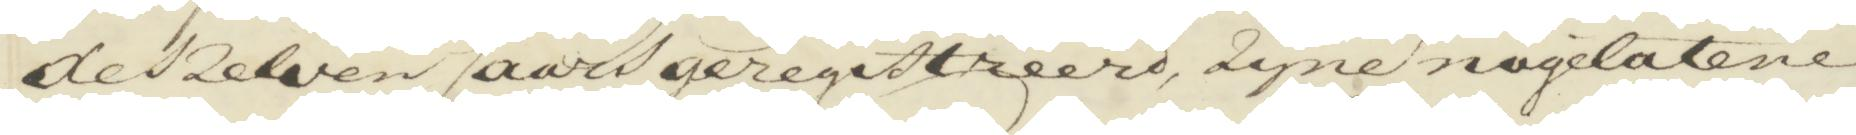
deszelven Jaars geregistreerd, zijne nagelatene
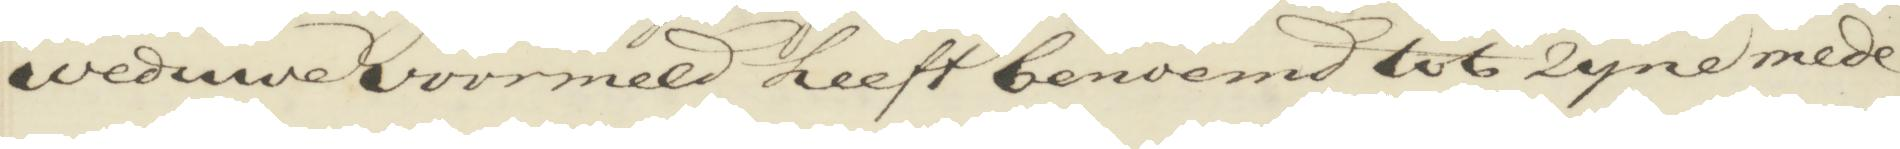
weduwe voormeld heeft benoemd tot zyne mede
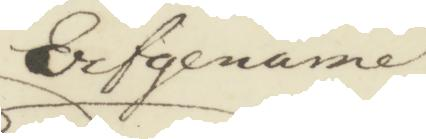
Erfgename
